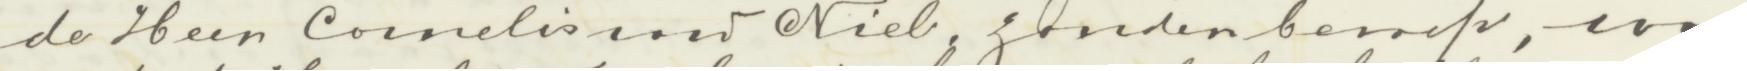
de Heer Cornelis van Niel, zonder beroep, wo
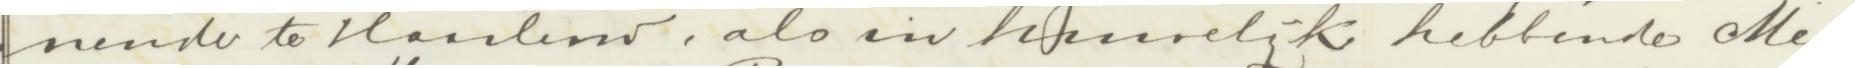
nende te Haarlem, als in huwelijk hebbende Me.
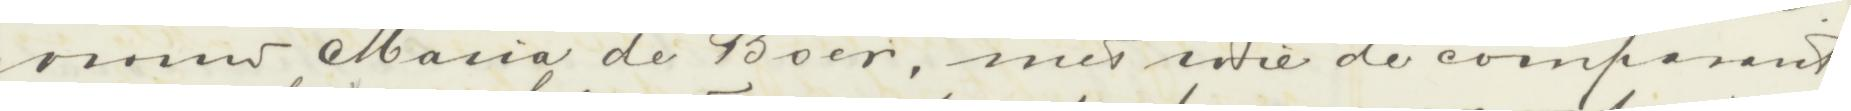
vrouw Maria de Boer, met wie de comparant
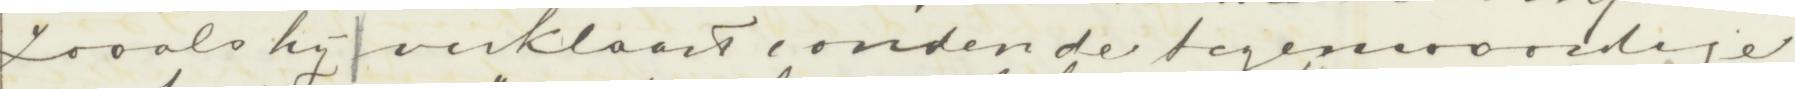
zooals hy verklaart, onder de tegenwoordige
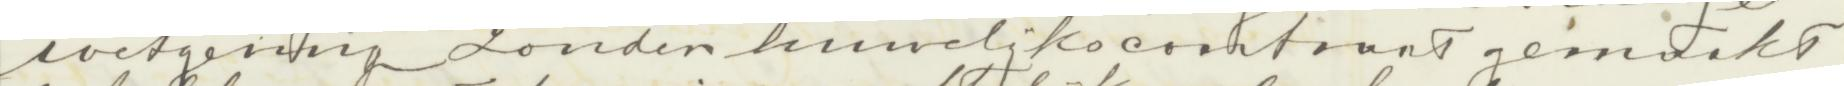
wetgeving zonder huwelijkscontract gemaakt
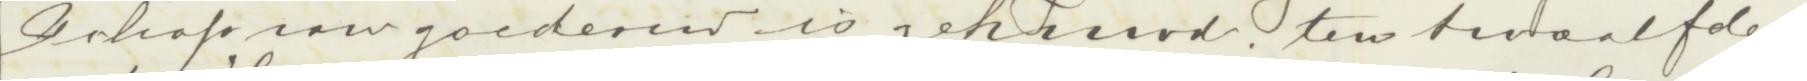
schap van goederen is gehuwd. ten twaalfde;
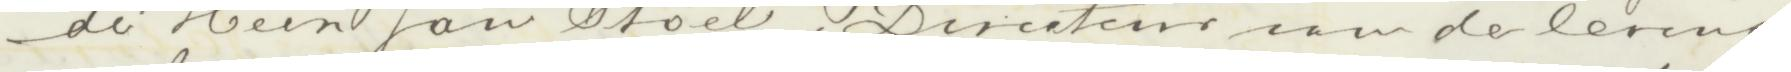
de Heer Jan Stoel, Directeur van de Levens
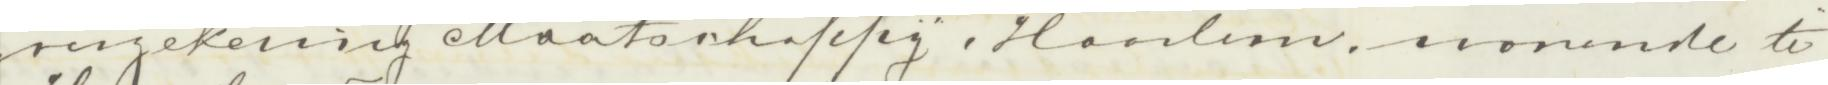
verzekering Maatschappij, Haarlem, wonende te
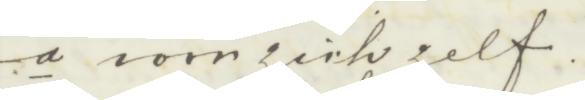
a voor zich zelf.
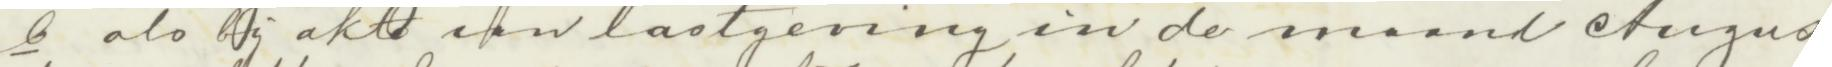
b als bij akte van lastgeving in de maand Augus
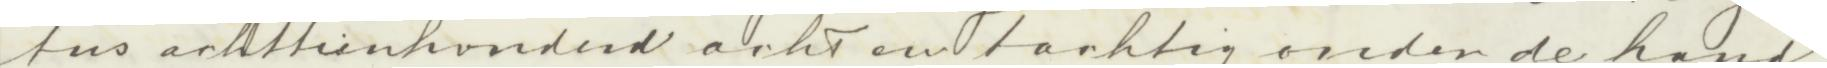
tus achttienhonderd acht en tachtig onder de hand
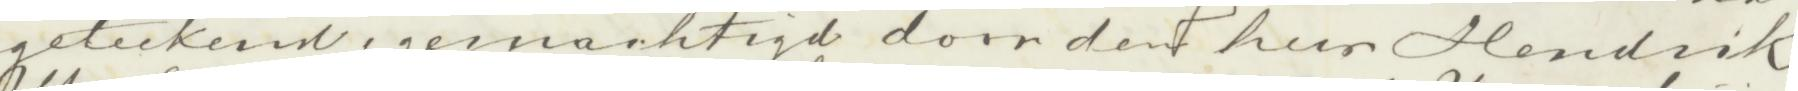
geteekend, gemachtigd door den heer Hendrik
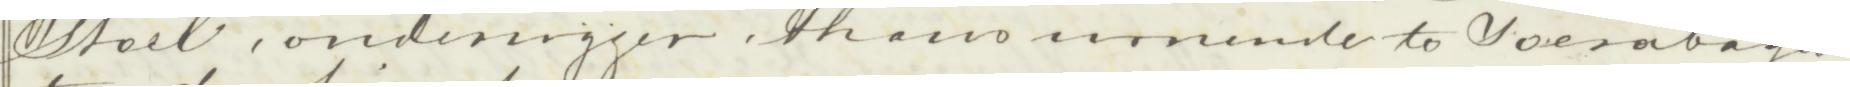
Stoel, onderwijzer, thans wonende te Soerabaja
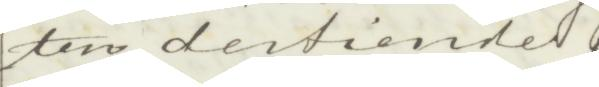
ten dertiende
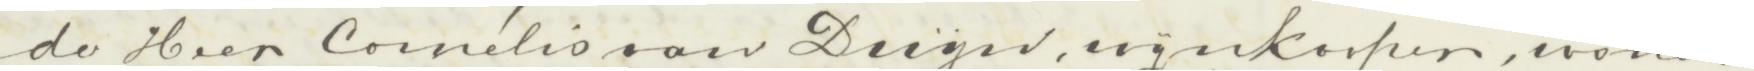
de Heer Cornelis van Duijn, wijnkooper, wonen
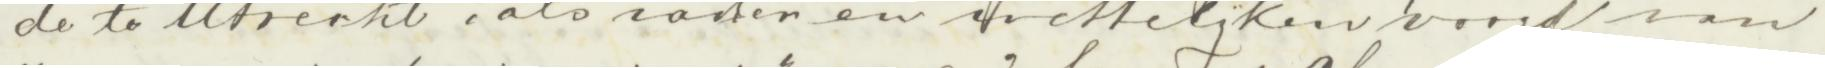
de te Utrecht, als vader en wettelijken voogd van
